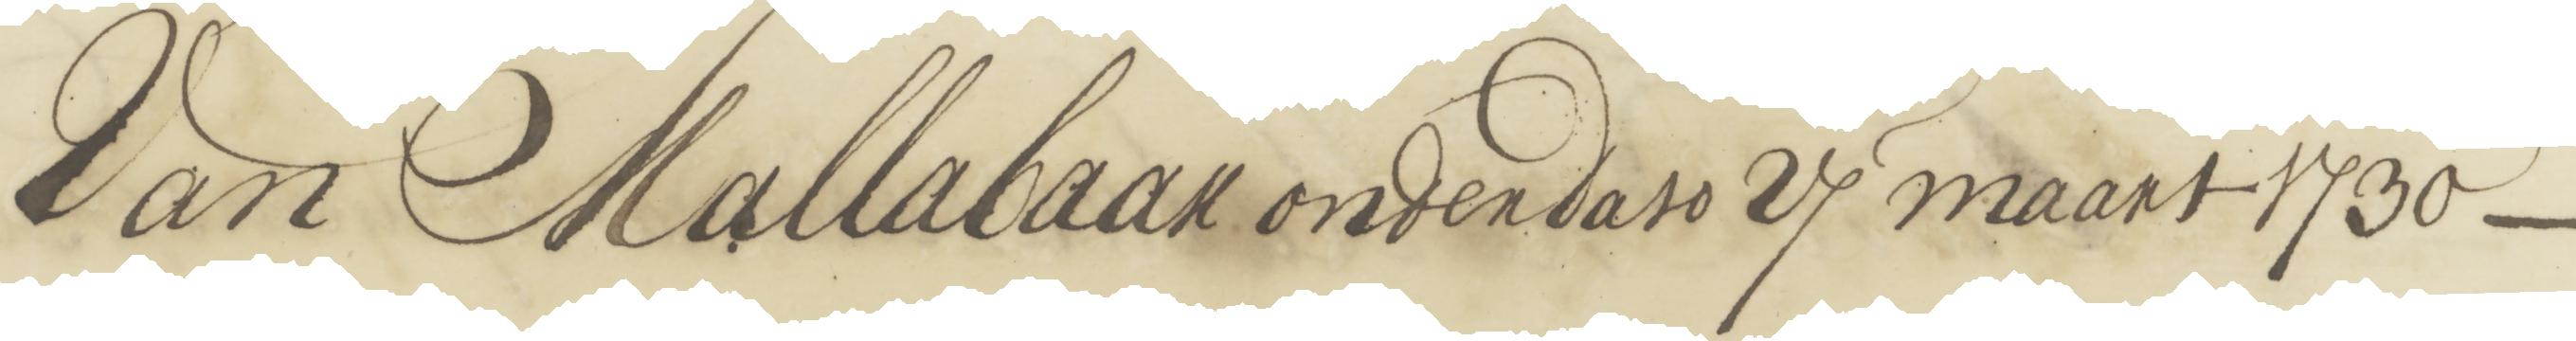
Van Mallabaar onder dato 27' maart 1730 —
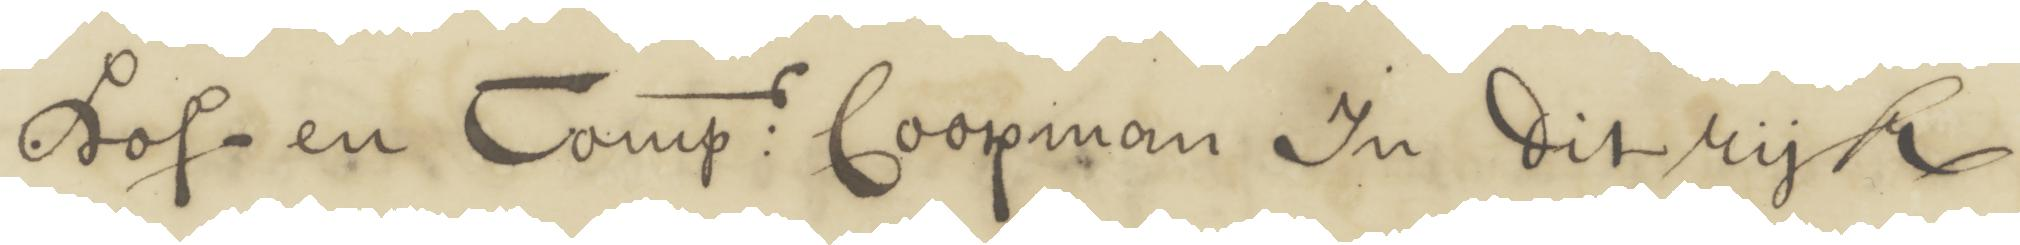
Hof en Comp:s Coopman In dit rijk
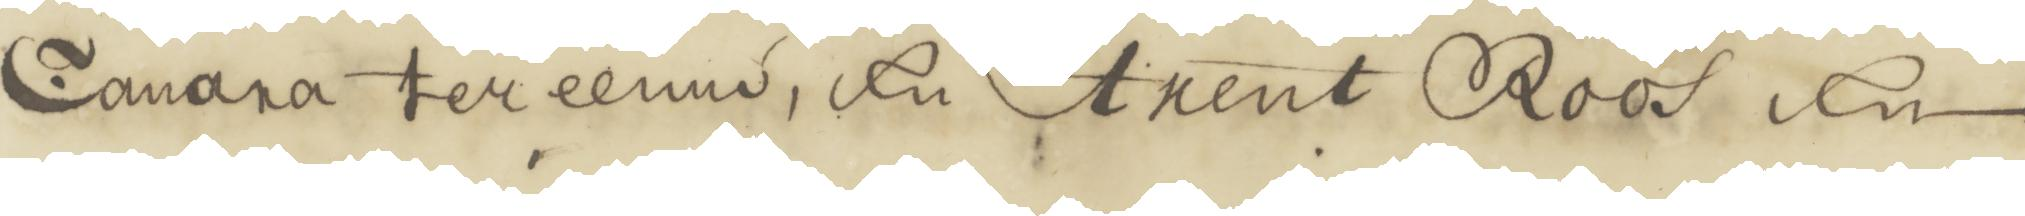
Canara ter eenre, En Arent Roos En
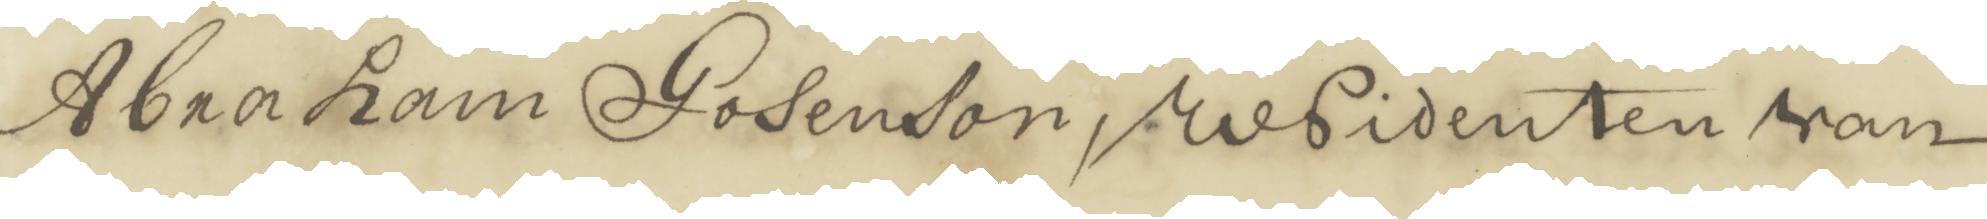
Abraham Gosenson, residenten van
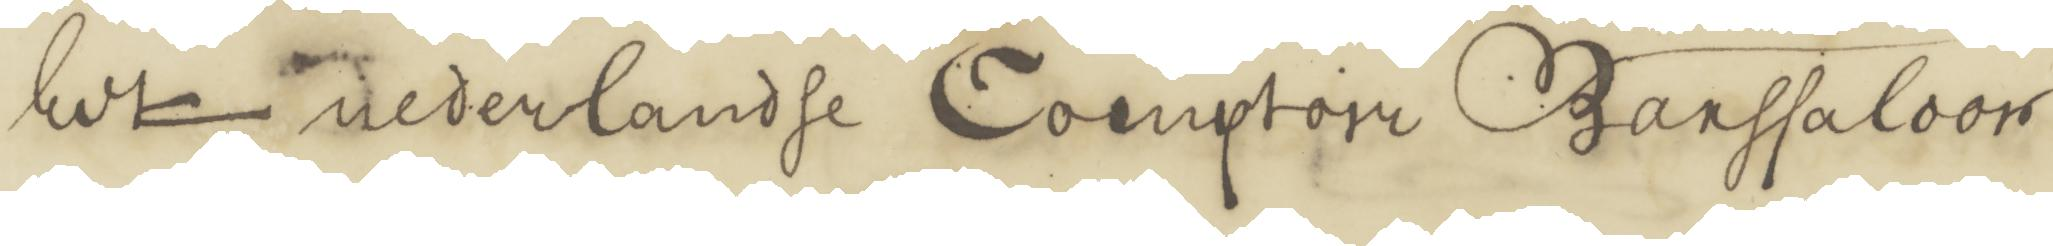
het nederlandse Comptoir Barssaloor
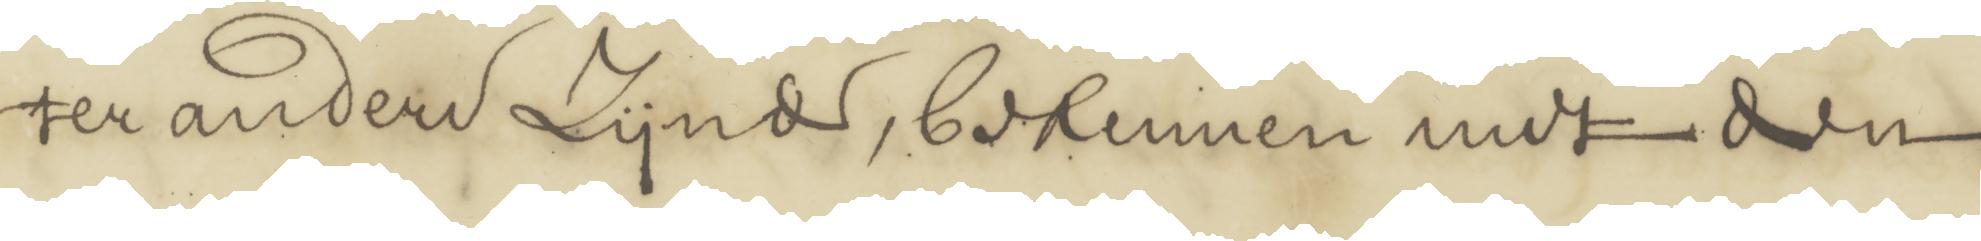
ter andere zijnde, bekennen met den
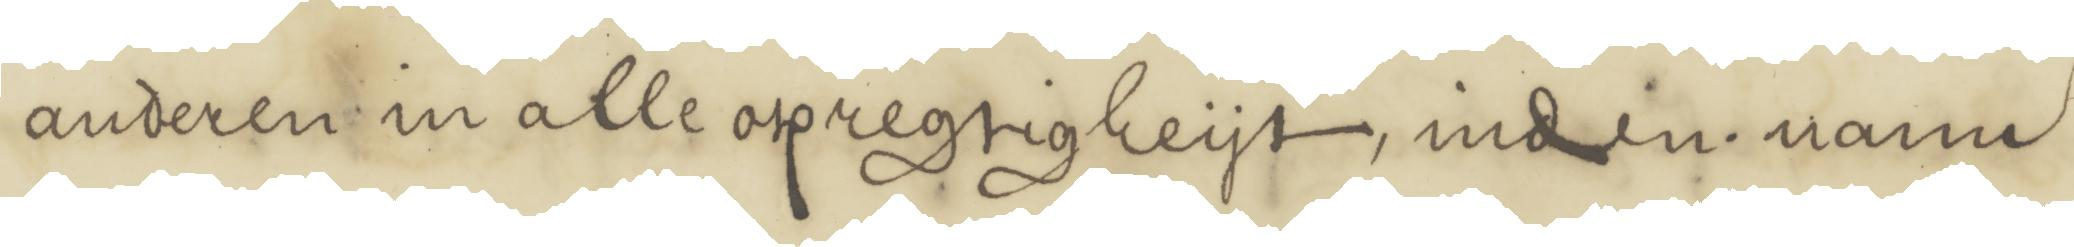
anderen in alle opregtigheijt, inden name
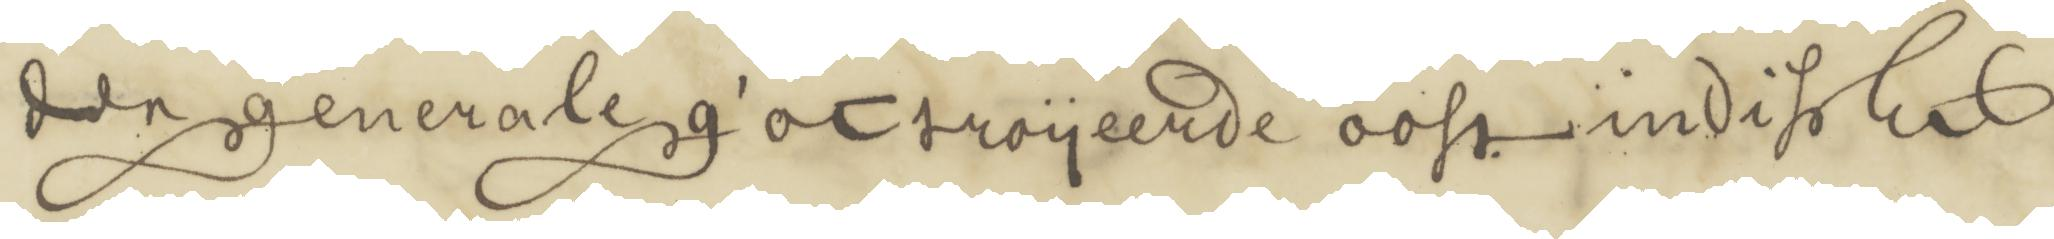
der generale g’octroijeerde oost indische
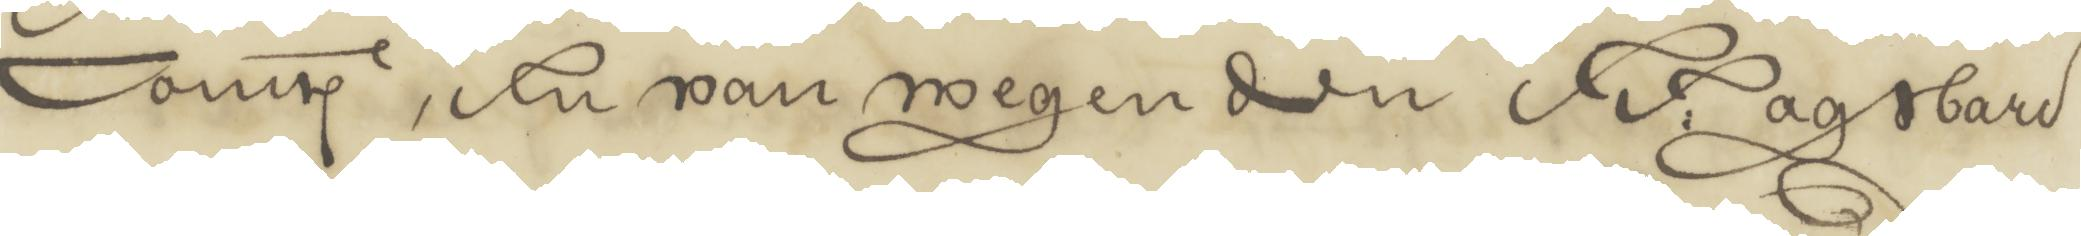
Compe, En van wegen den EE: agtbare
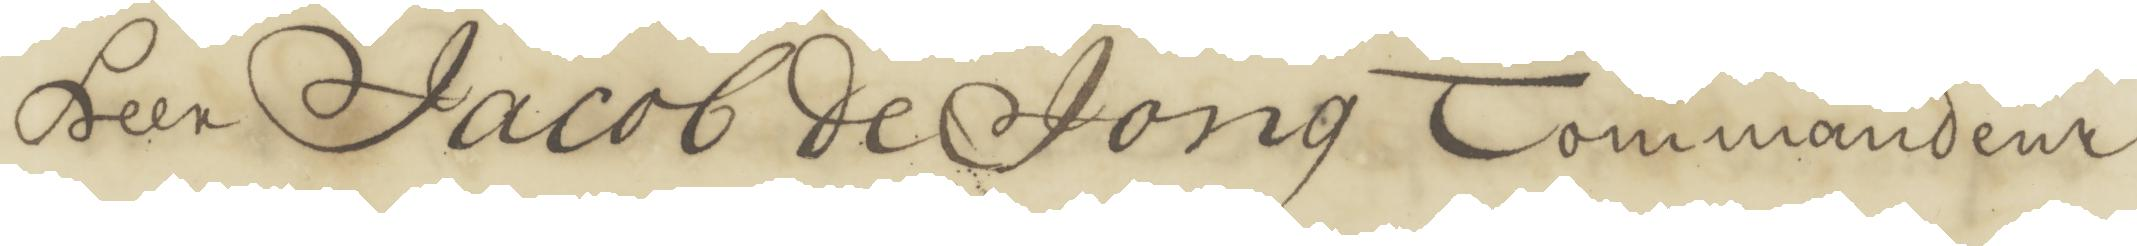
Heer Iacob de Iong Commandeur
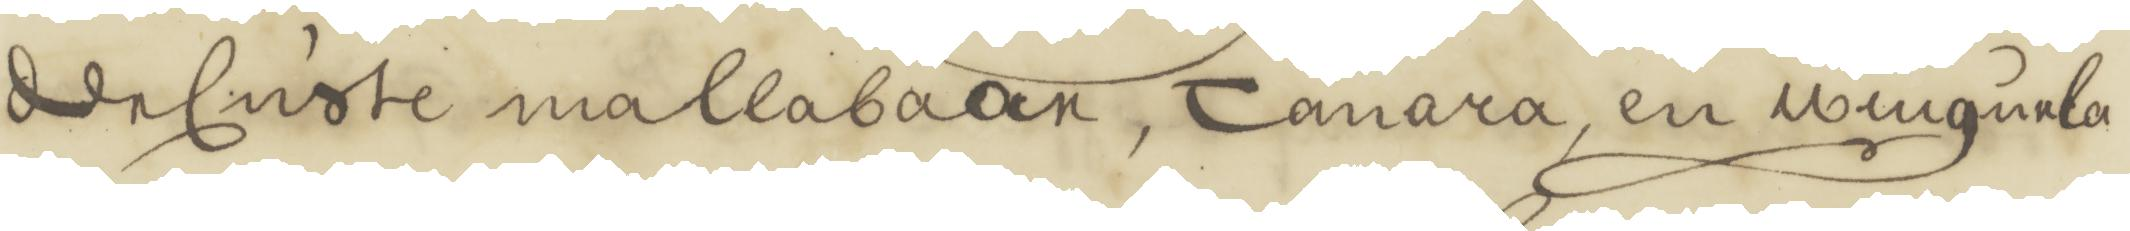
der Custe mallabaar, Canara, en wingurla
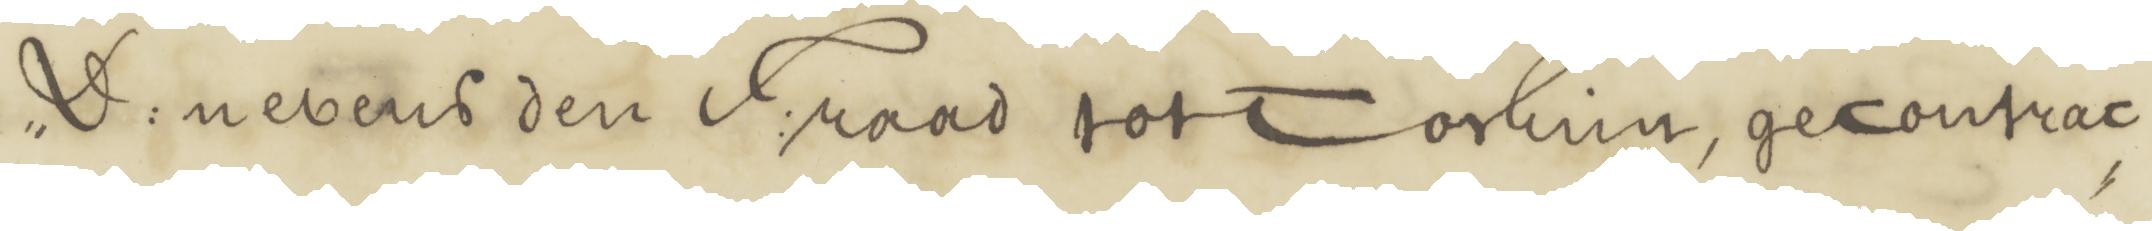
„te: nevens den E: raad tot Cochim, gecontrac„
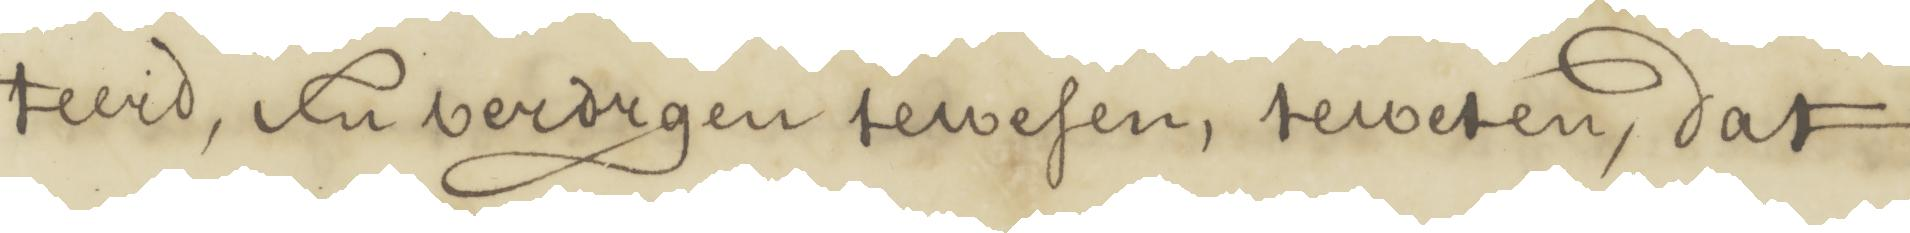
teerd, En verdrgen tewesen, teweten, dat
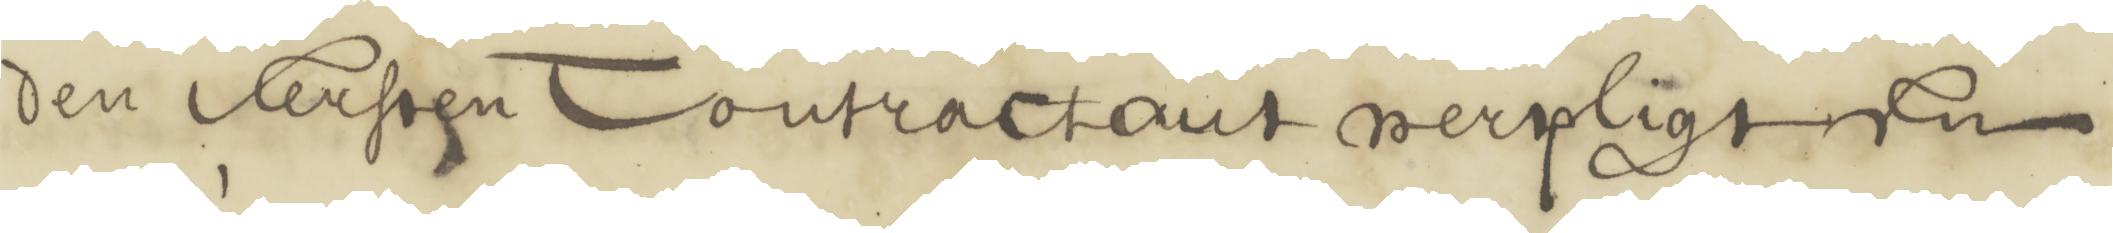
den Eersten Contractant verpligt En
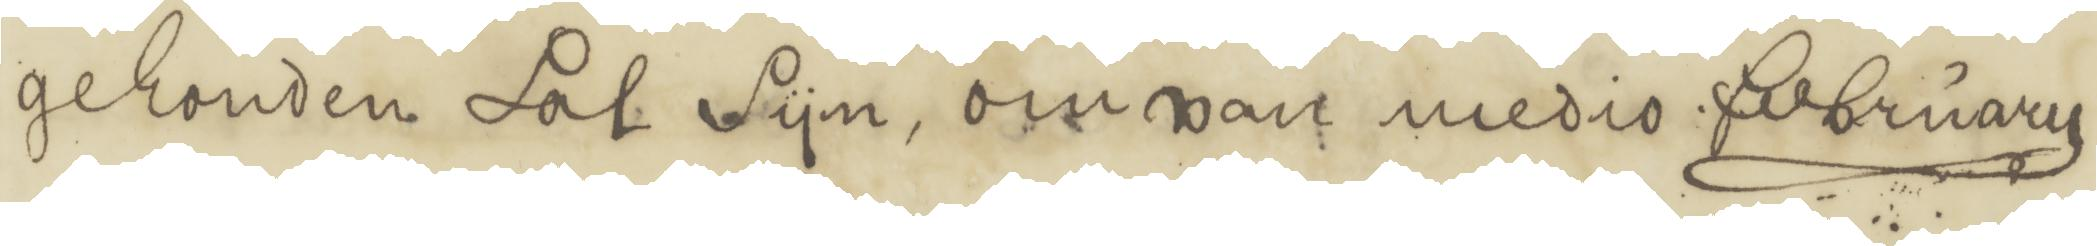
gehouden sal sijn, om van medio february
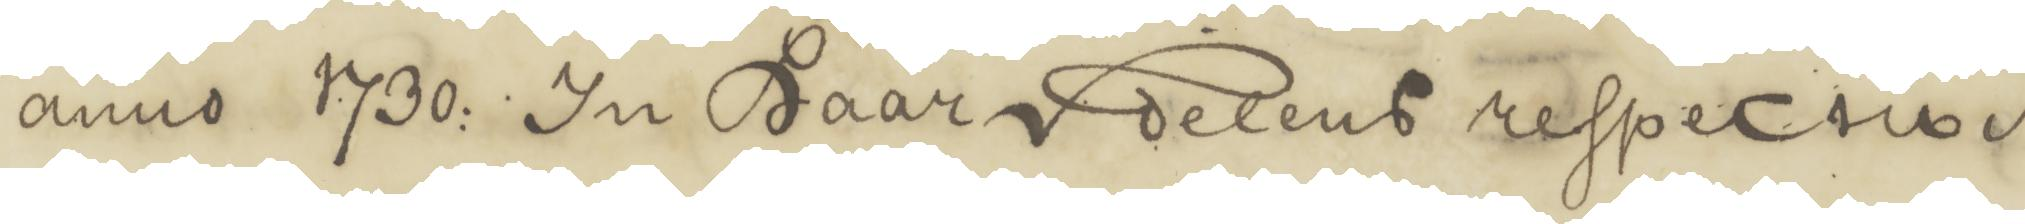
anno 1730: In Haar Edelens respecive
